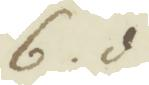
6. d
